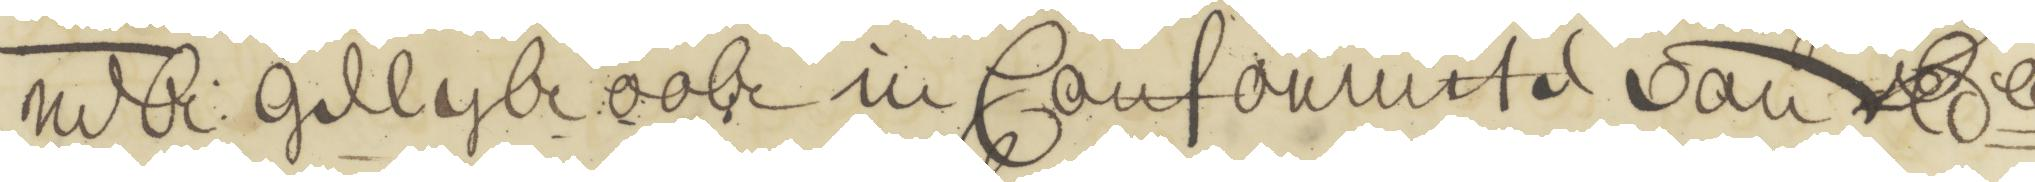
rek: gelyk ook in conformite van UEd=le
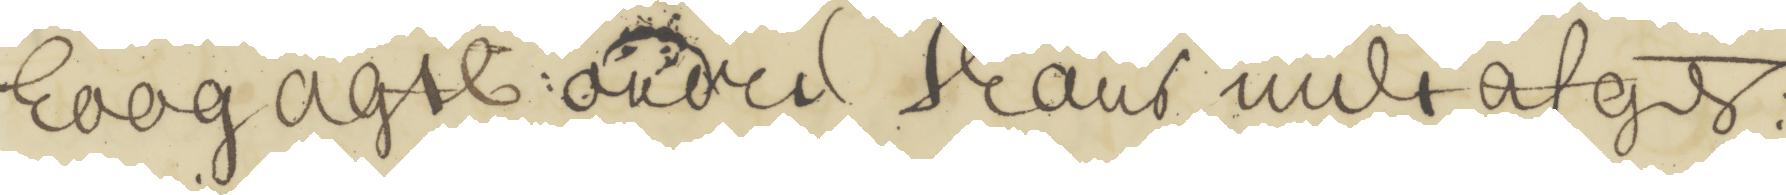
hoog agtb: ordre thans met afges:
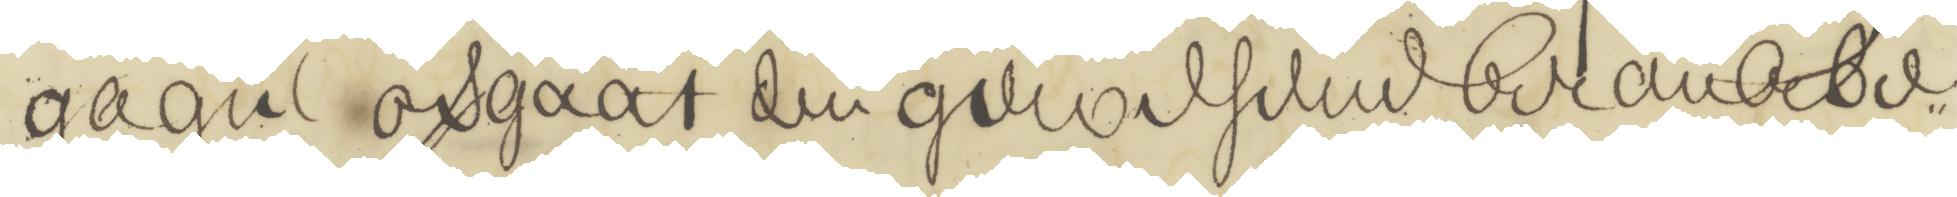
gagie overgaat den gewesene krankbe„
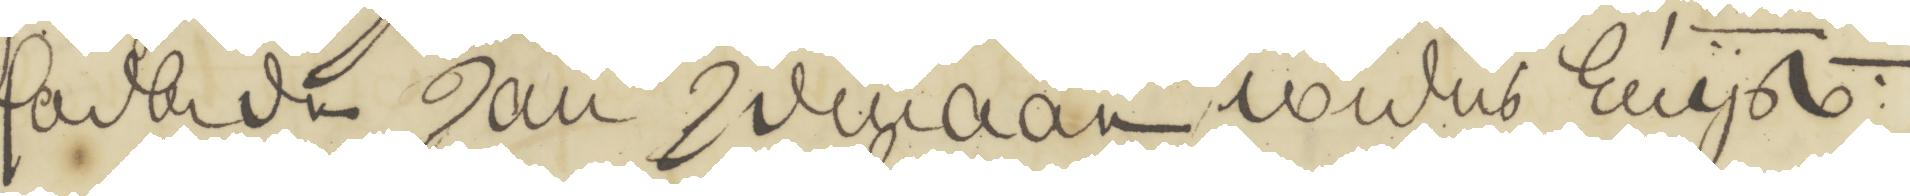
soeker Jan Jemaar wiens huijsv:
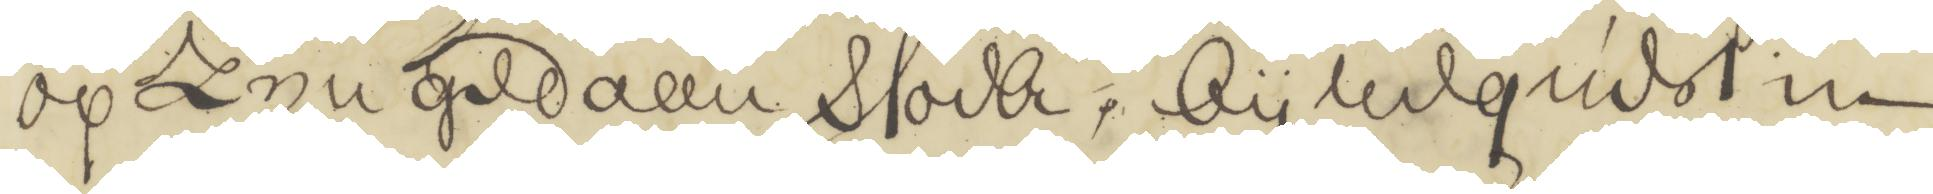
op Zyn gedaen versoek, bij request in
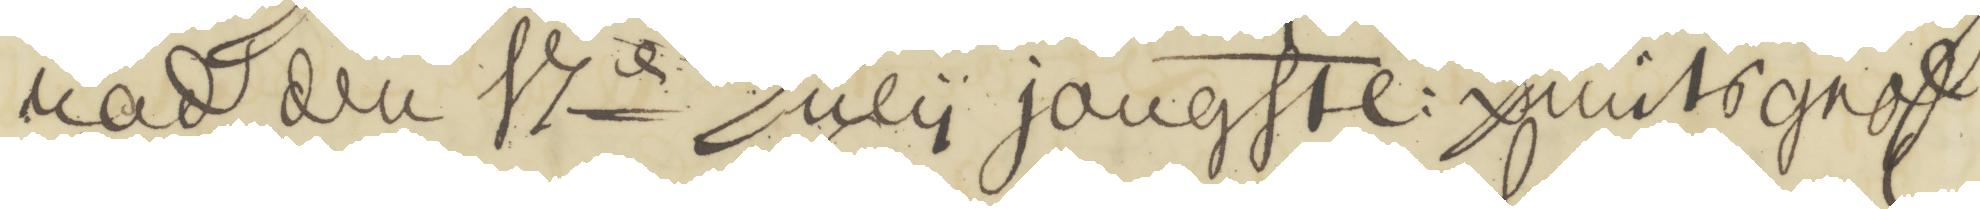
rade den 17=en Iulij jongstl: vermits grof
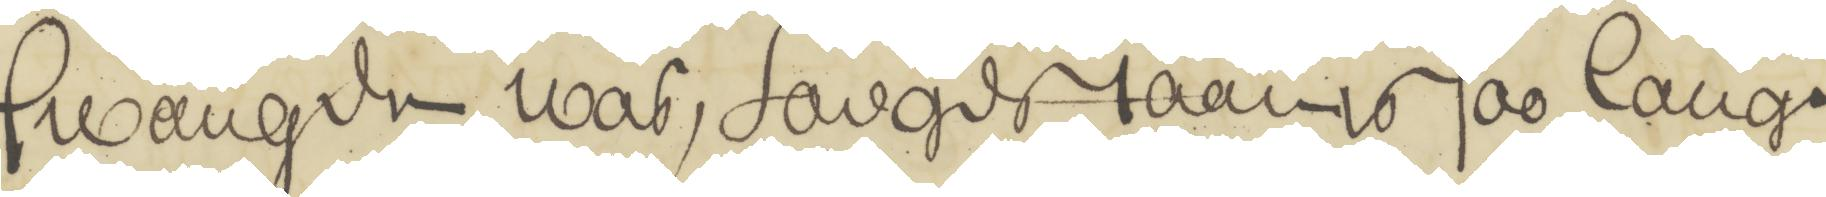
swanger was, toegestaan is soo lange
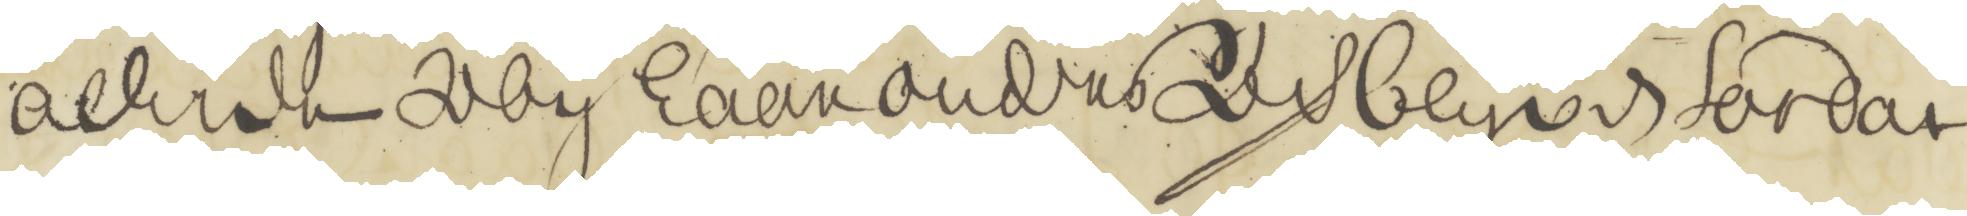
alhier tebij haar ouders te verblyven totdat
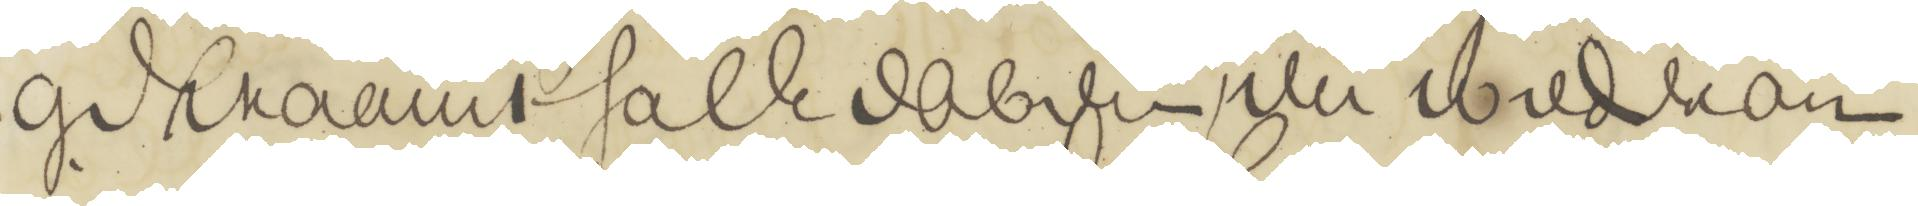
gekraamt salhebben, en wederon
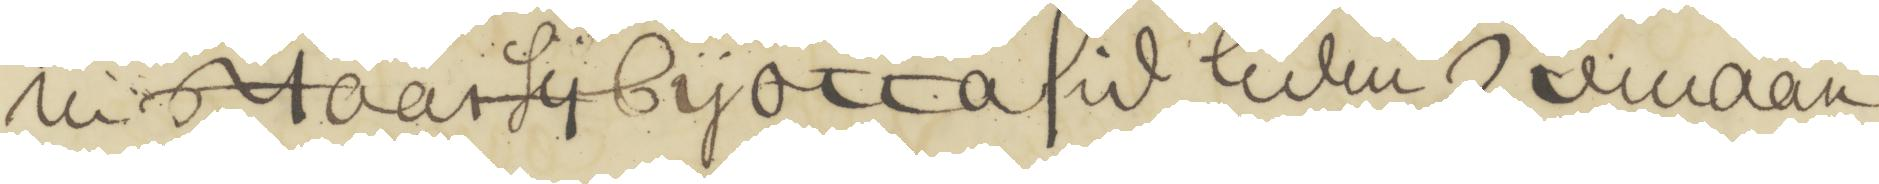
in staat sij bij occasie hem Jemaar
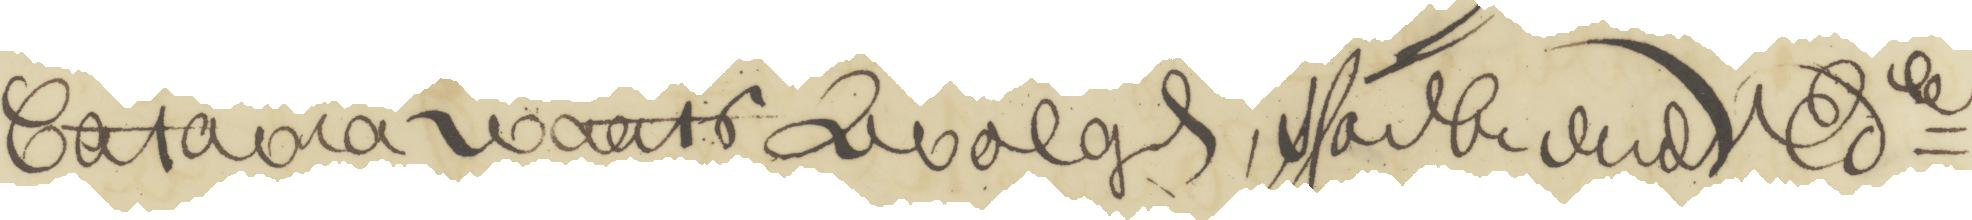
batavia waats te volgen, versoekende UEd=le
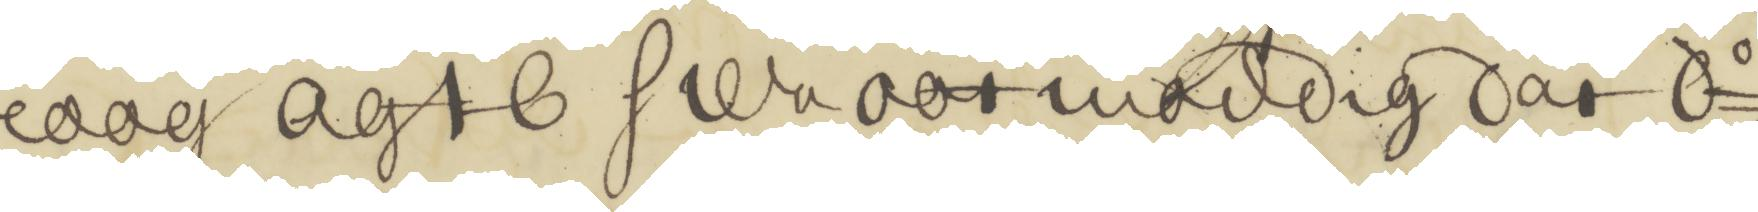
hoog agtb seer oot moedig dat d=o
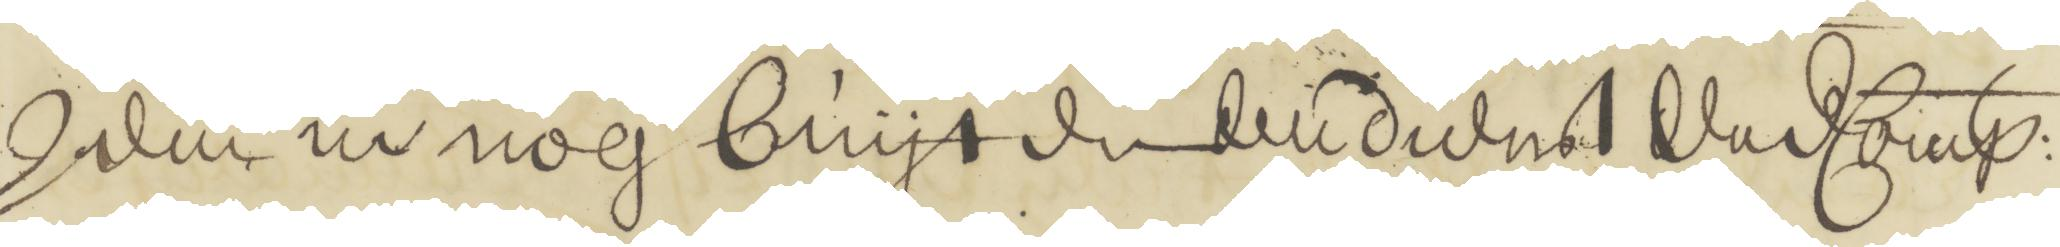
Jem„ber nog buijt en den dienst derEComp:
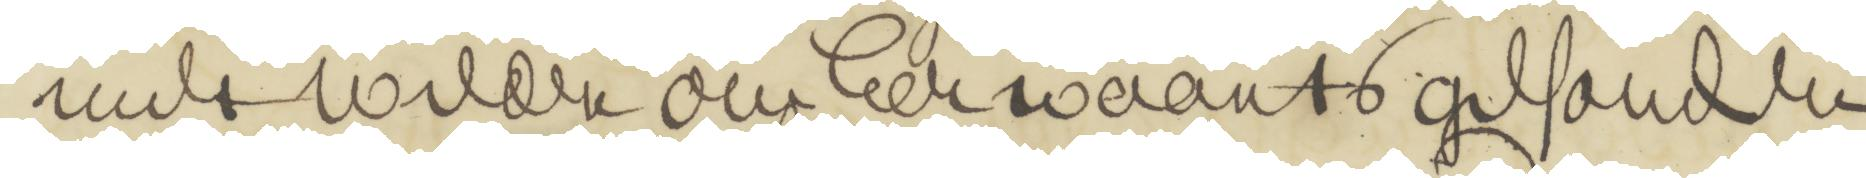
niet weder om herwaarts gesonden
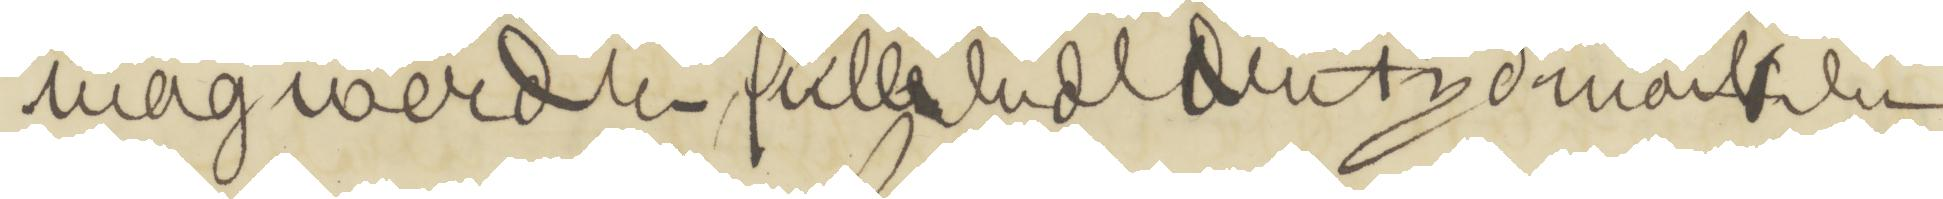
mag werden sullende den tyd mochten
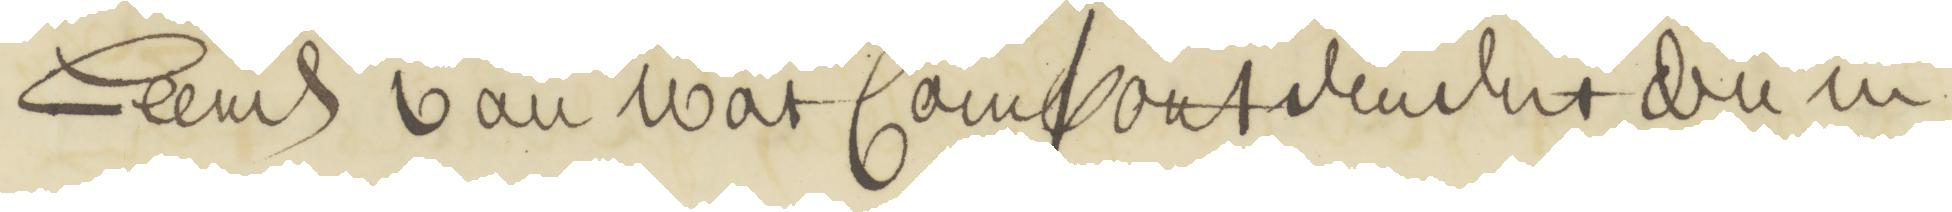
leeren van wat Comportement den in
